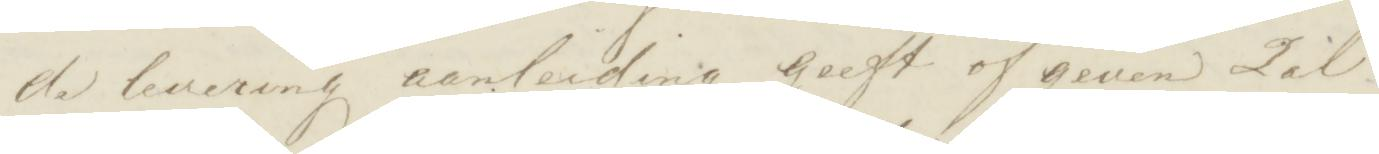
de levering aanleiding geeft of geven zal
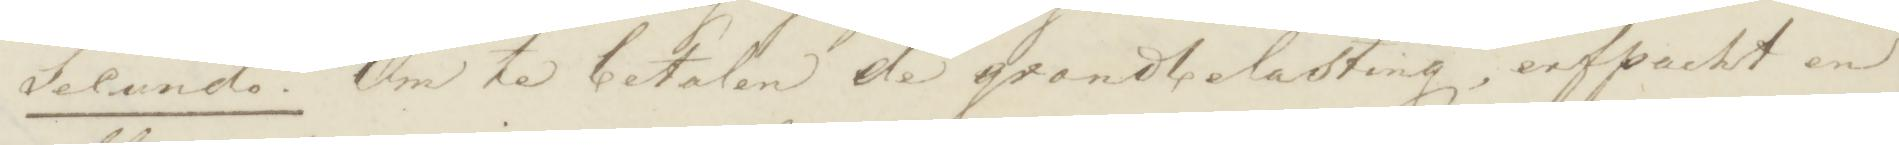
Secundo. Om te betalen de grondbelasting, erfpacht en
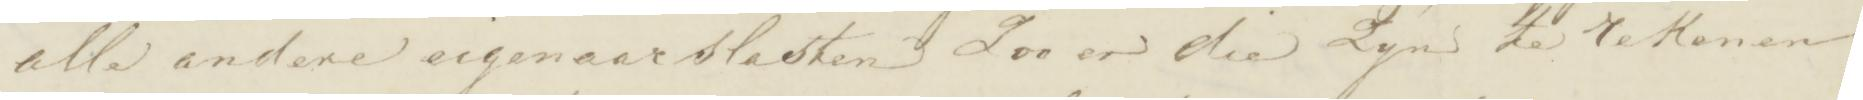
alle andere eigenaarslasten zoo er die zyn te rekenen
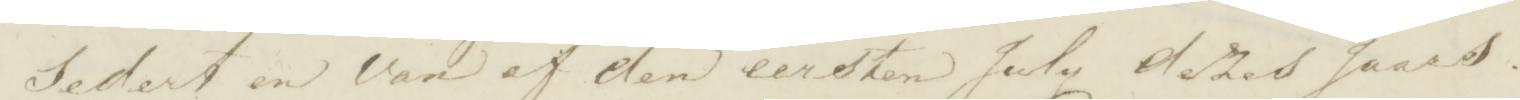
sedert en van af den eersten July dezes Jaars.
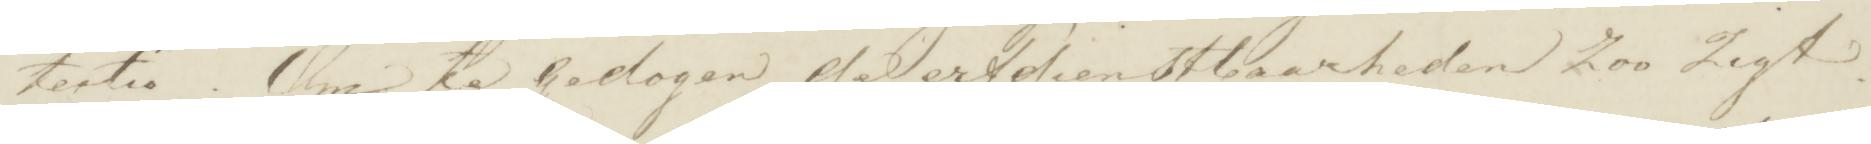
tertio. Om te gedogen de erfdienstbaarheden zoo zigt
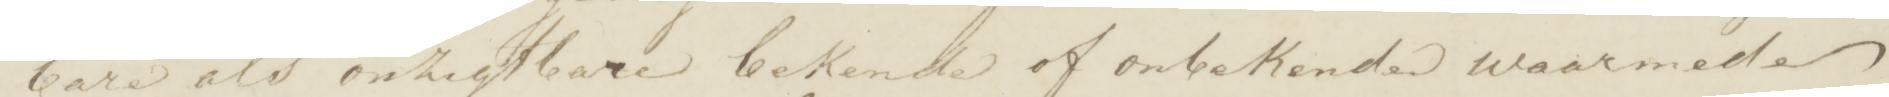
bare als onzigtbare bekende of onbekende waarmede
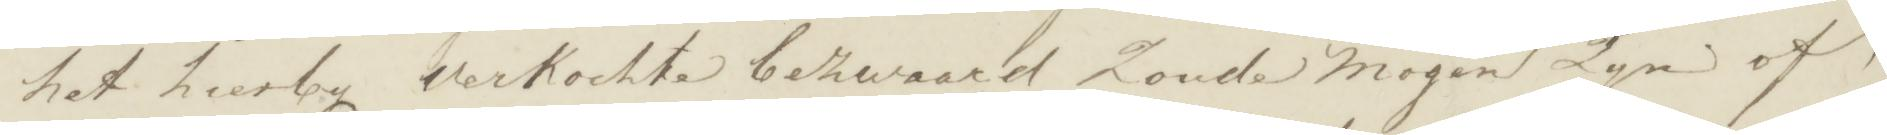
het hierby verkochte bezwaard zoude mogen zyn of
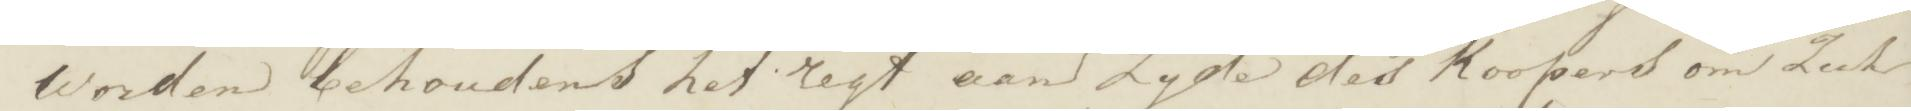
worden behoudens het regt aan zyde des koopers om zich
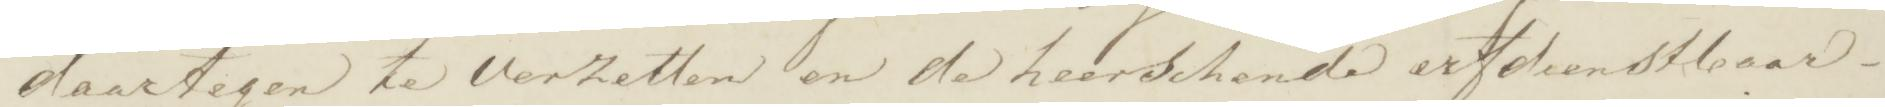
daartegen te verzetten en de heerschende erfdienstbaar-
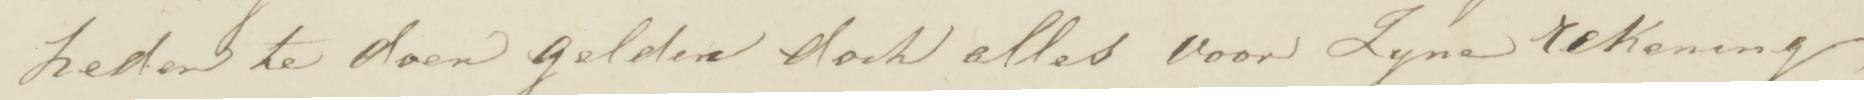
heden te doen gelden doch alles voor zyne rekening
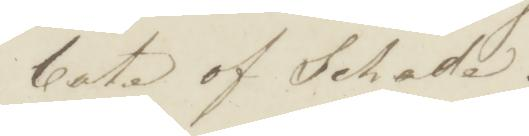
bate of schade.
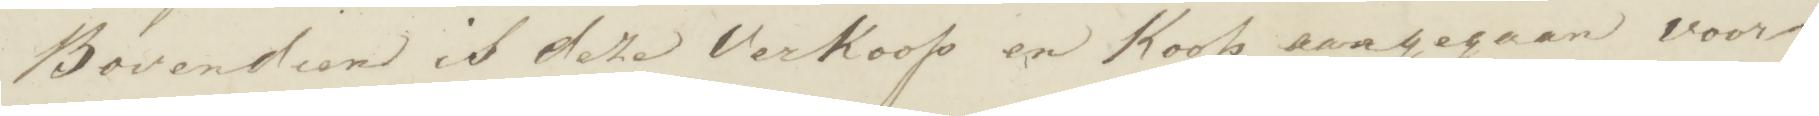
Bovendien is deze verkoop en koop aangegaan voor
